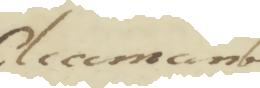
diamant
